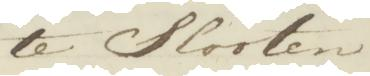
te Slooten
